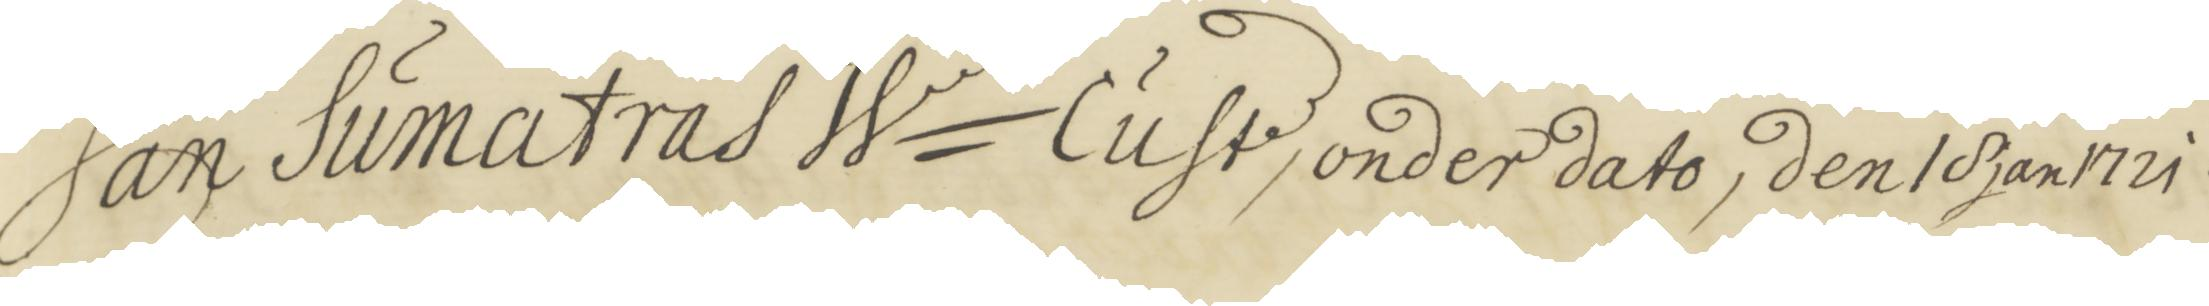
Van Sumatras W=t Cust, onder dato, den 18 jan 1721.
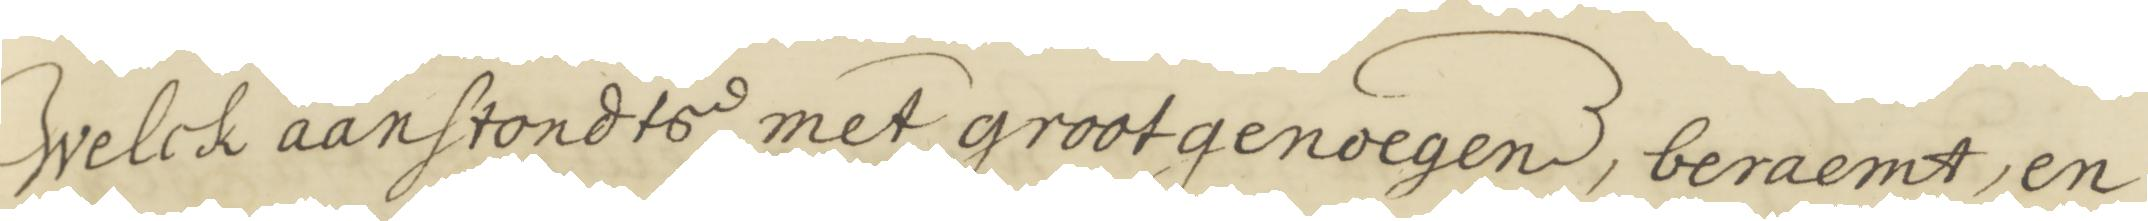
welck aanstondts met groot genoegen, beraemt, en
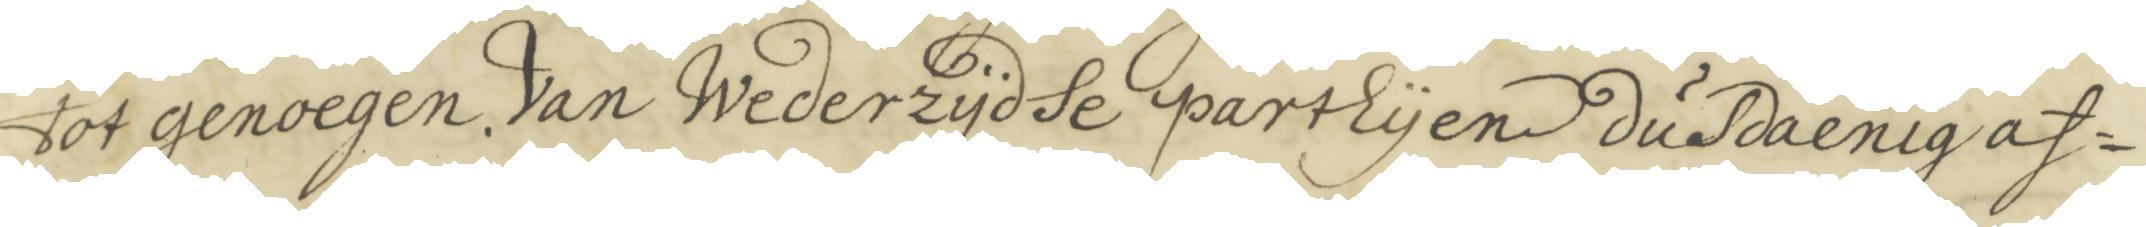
tot genoegen. van wederzijdse parthijen dusdaenig af=
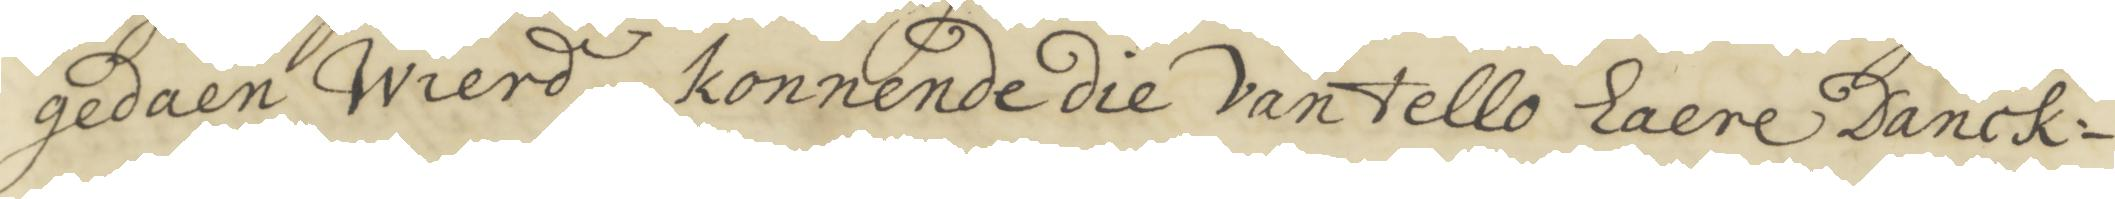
gedaen wierd, konnende die van tello haere Danck=
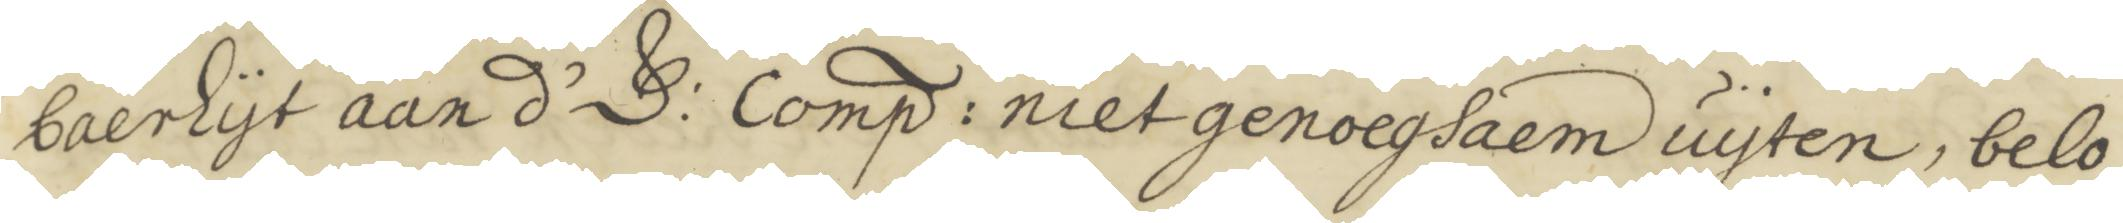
baerhijt aan d’ E: Comp: niet genoegsaem uijten, belo
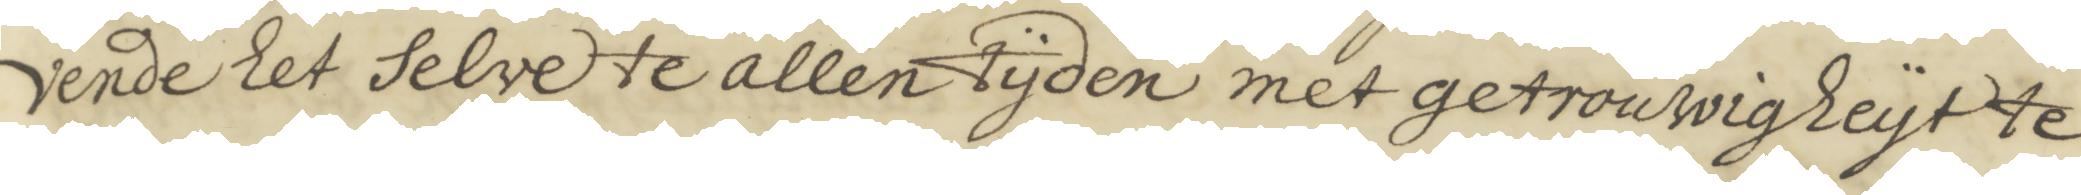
vende het selve te allen tijden met getrouwigheijt te
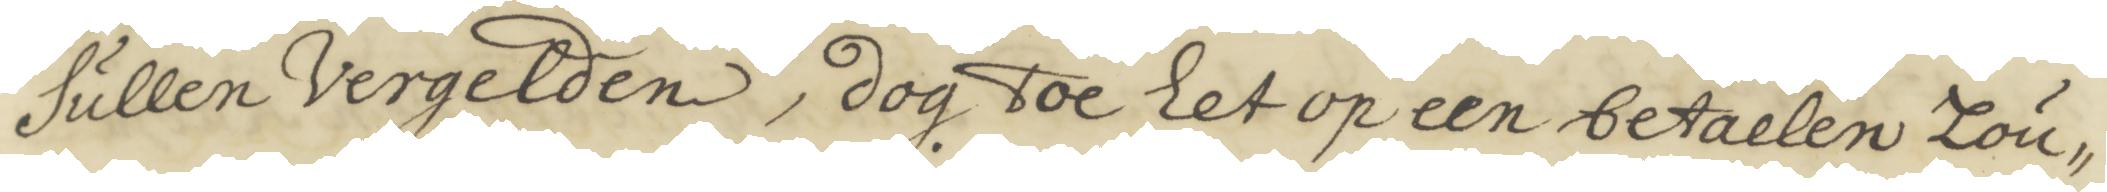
sullen vergelden, dog toe het op een betaelen zou„
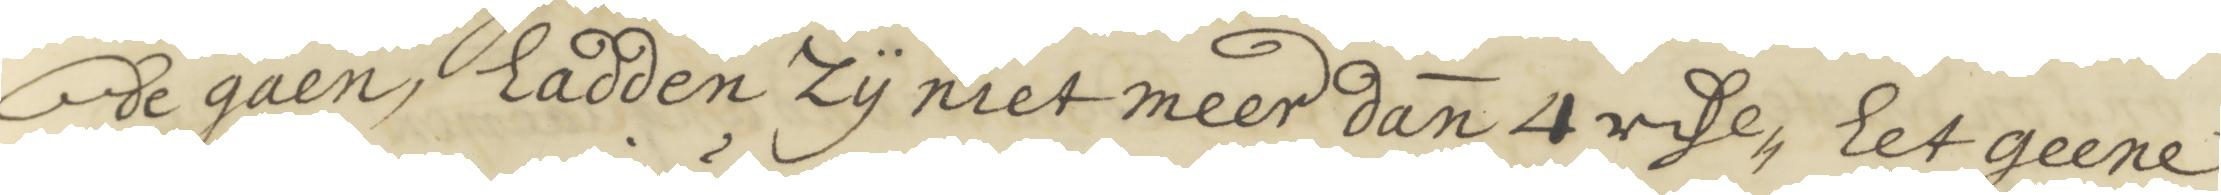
de gaen, hadden zij niet meer dan 4 rxs„ het geene
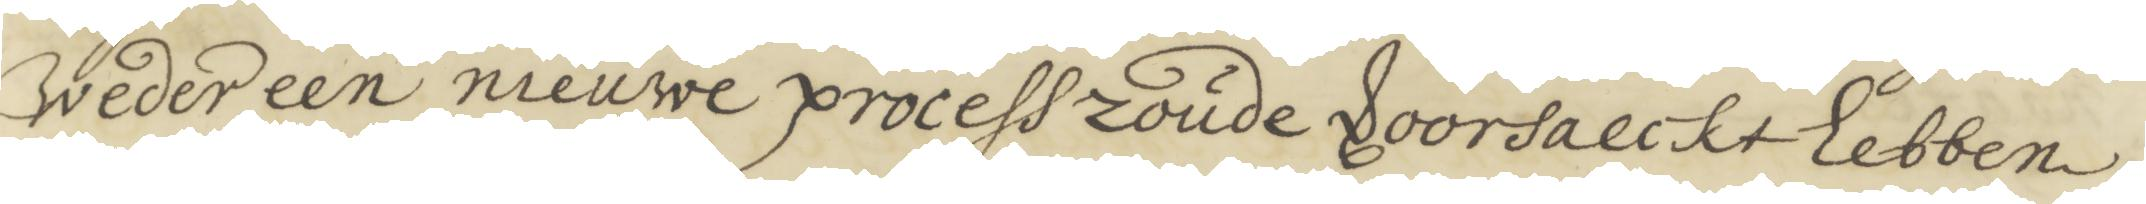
weder een nieuwe process zoude veroorsaeckt hebben,
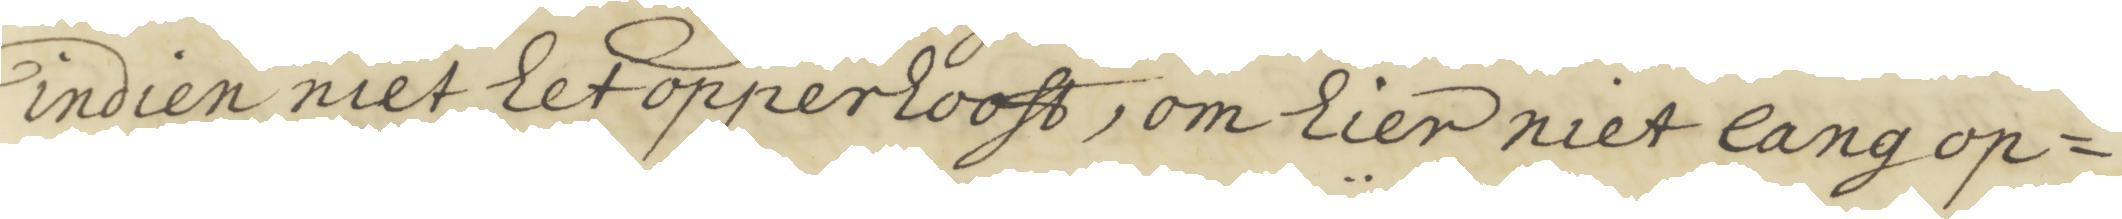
indien niet het opperhooft, om hier niet lang op=
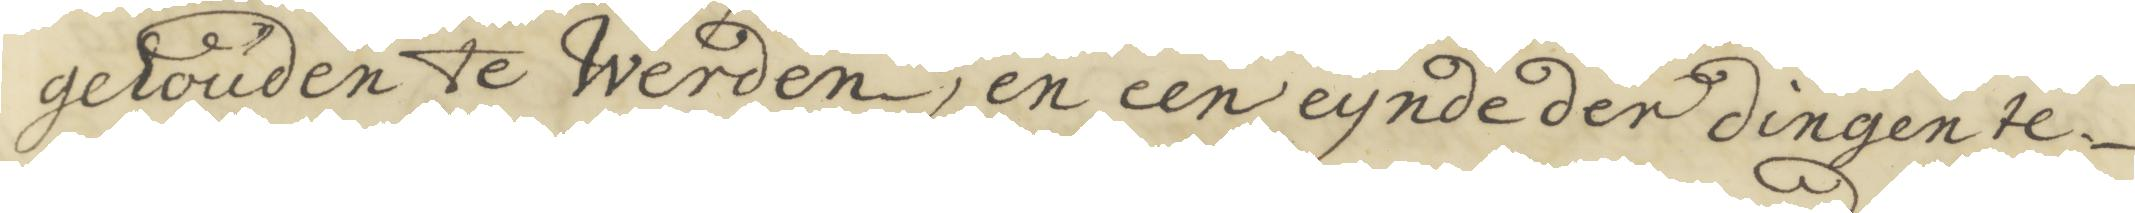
gehouden te werden, en een eijnde der dingen te=
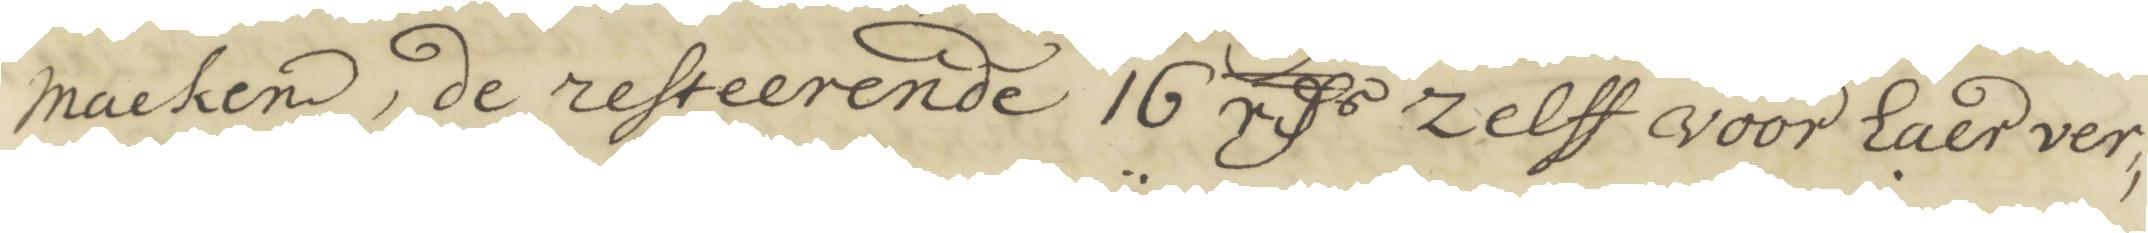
maeken, de resteerende 16 rxs zelff voor haer ver„
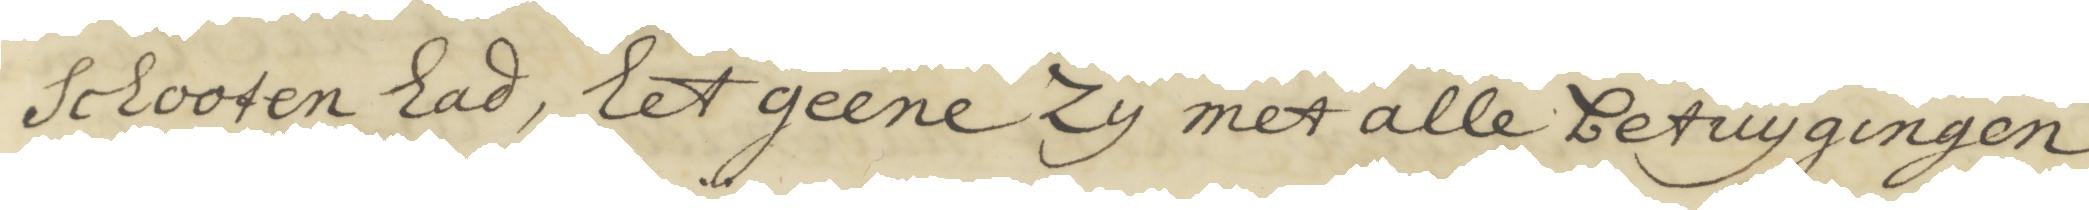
schooten had, het geene zij met alle betuijgingen
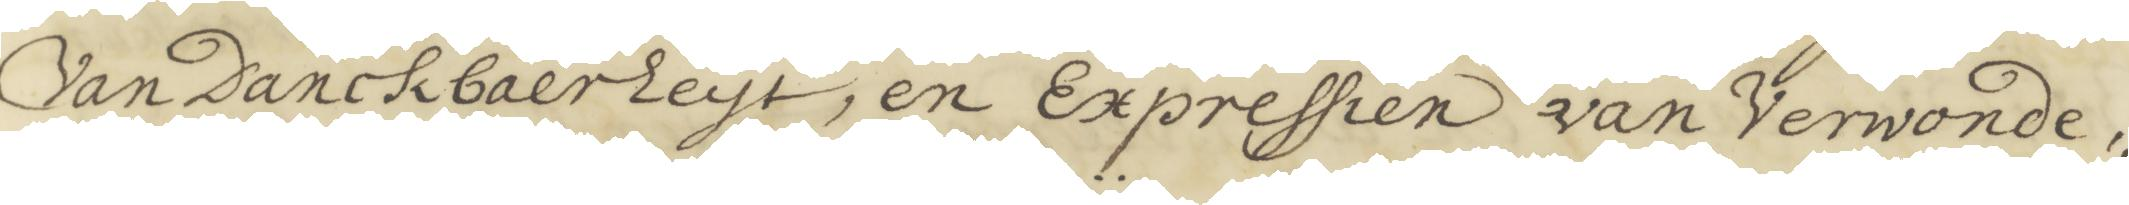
van danckbaerheijt, en Expressien van verwonde,
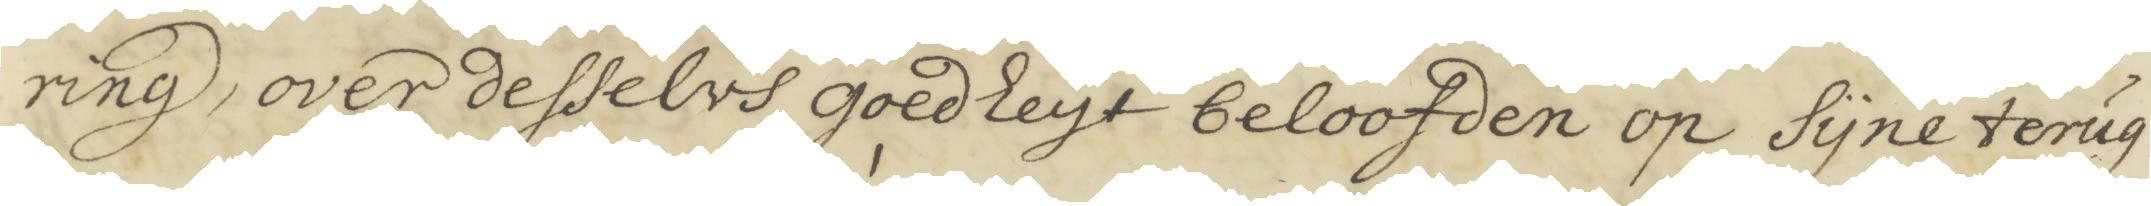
ring, over desselvs goedheijt beloofden op sijne terug
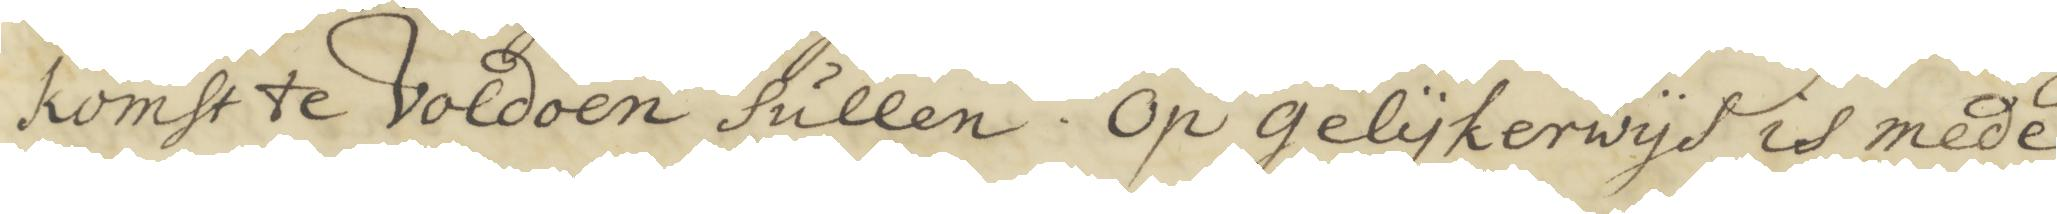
komst te voldoen sullen. Op gelijkerwijs is mede
